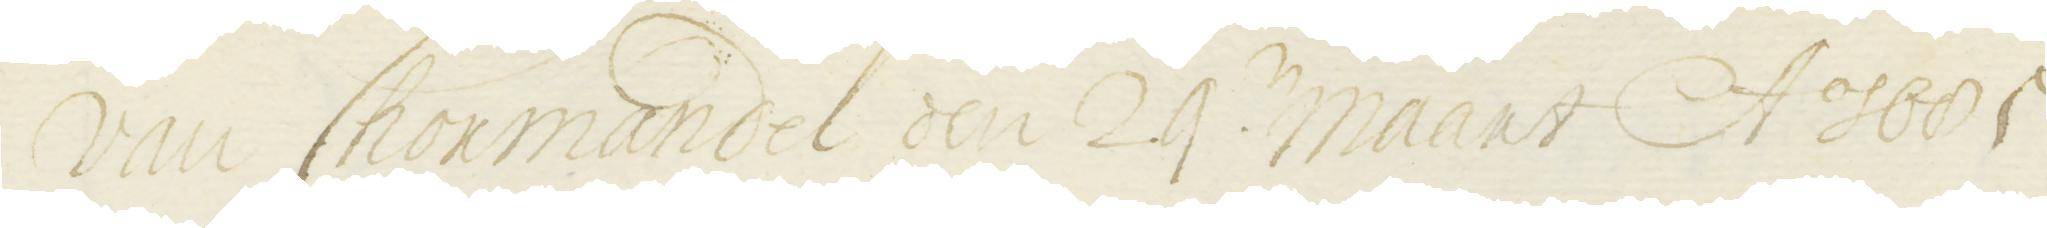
Van Chormandel den 24.n maart Ao 1685
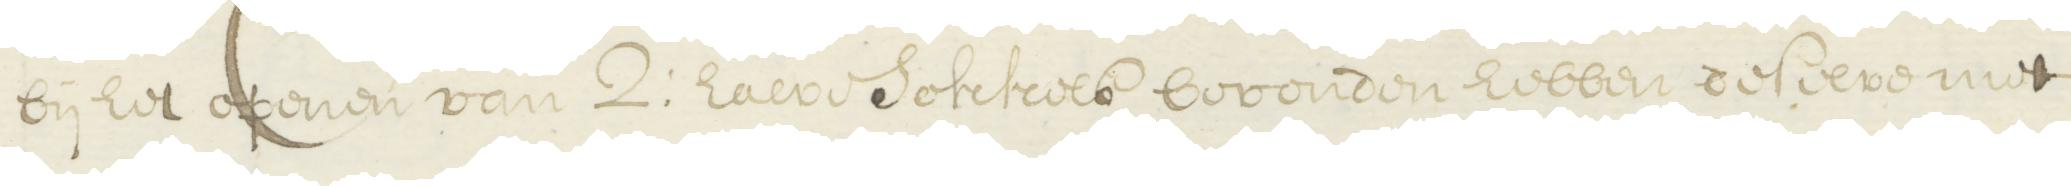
bij het openen van 2: halve sokkels bevonden hebben deselve niet
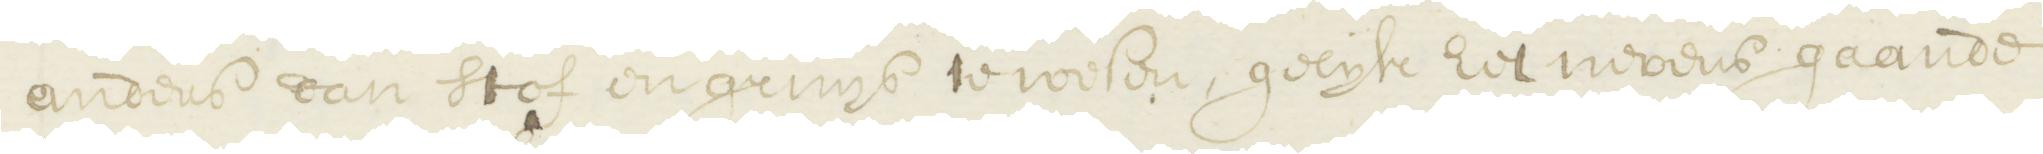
anders dan stof en gruijs te wesen, gelijk het nevens gaande
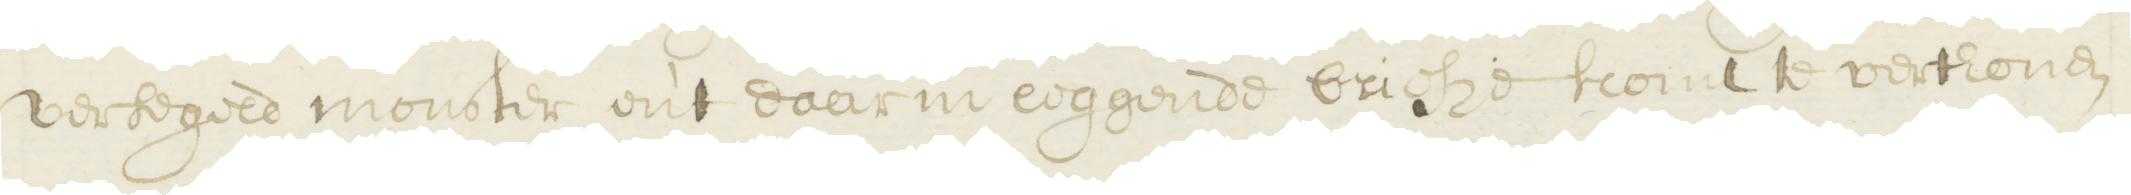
versegeld monster en’t daar in leggende briefje komt te verthonen
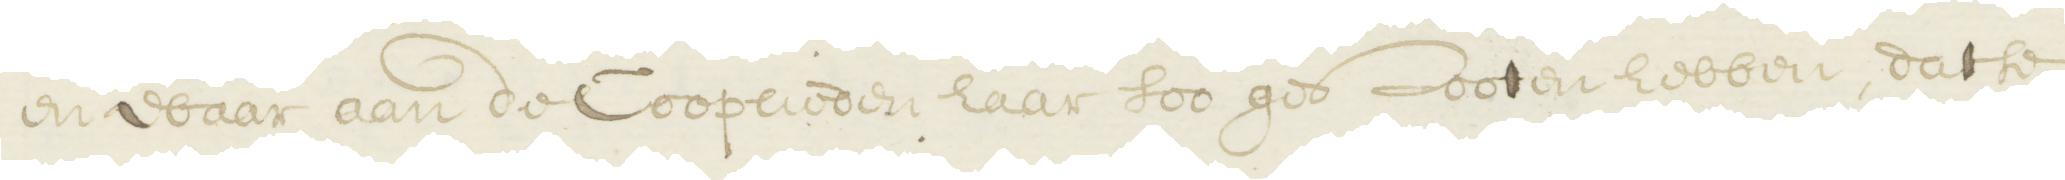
en waar aan de Cooplieden haar soo gestooten hebben, datse
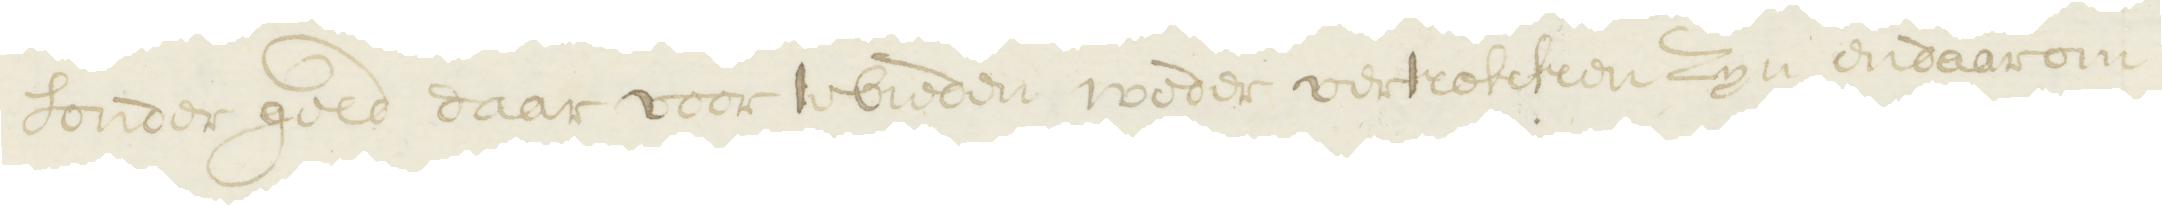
sonder geld daar voor te bieden weder vertrokken zijn en daarom
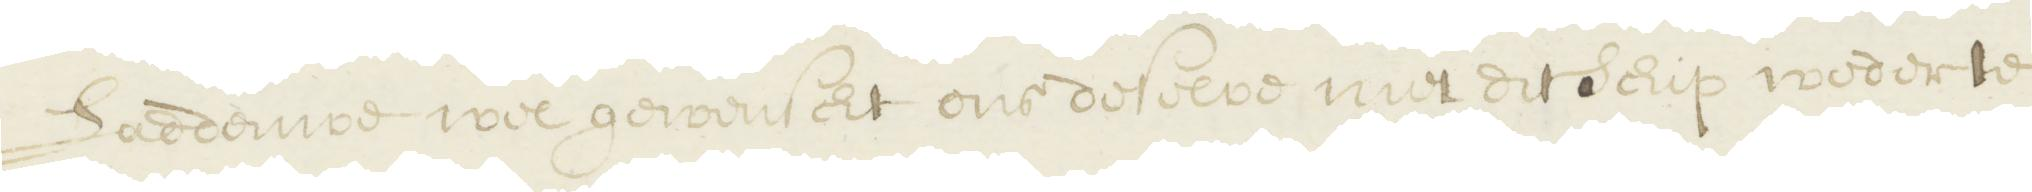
haddenwe wel gewenscht ons deselve met dit schip weder te
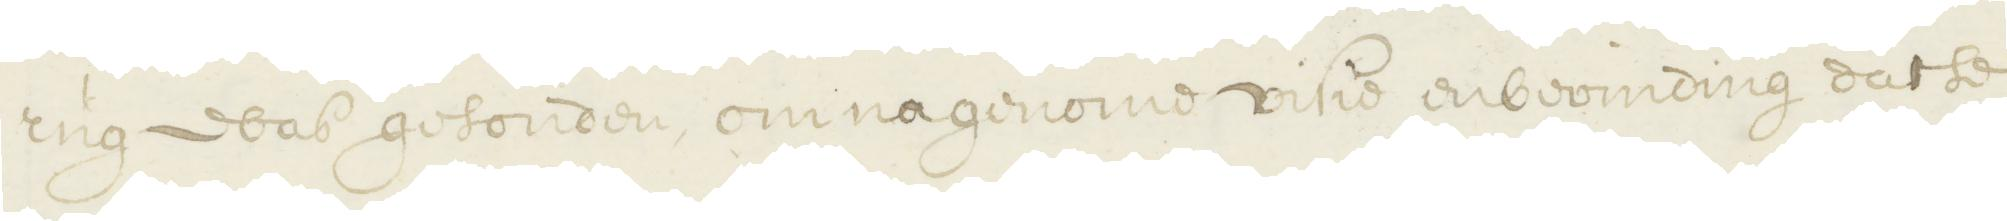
rug was gesonden, om nagenome visie en bevinding dat se
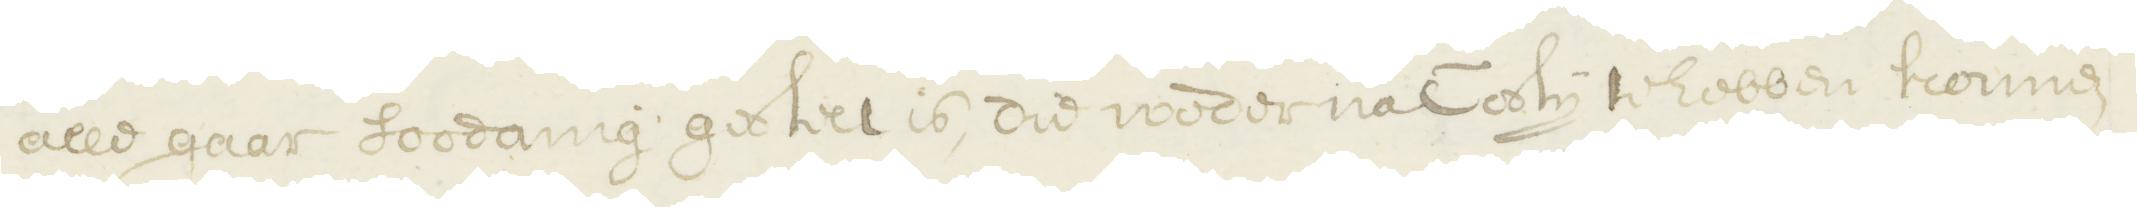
alle gaar soodanig gestelt is, die weder na Costij te hebben konnen
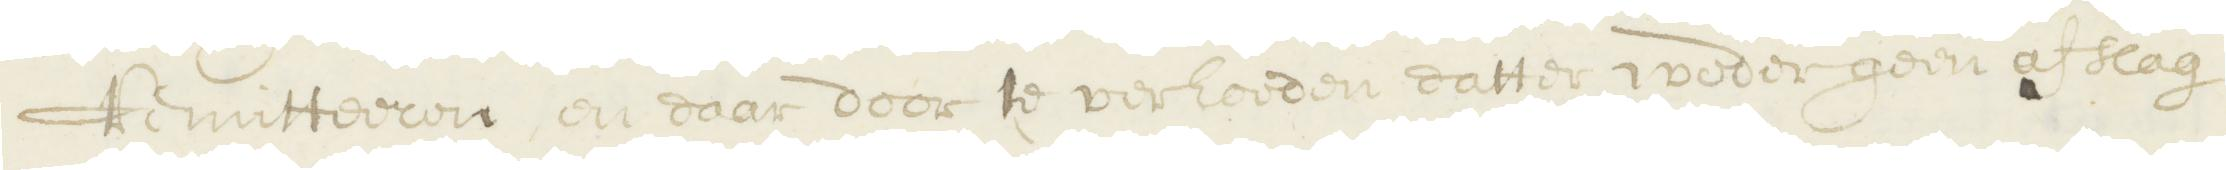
Remitteeren, en daar door te verhoeden datter weder geen afslag
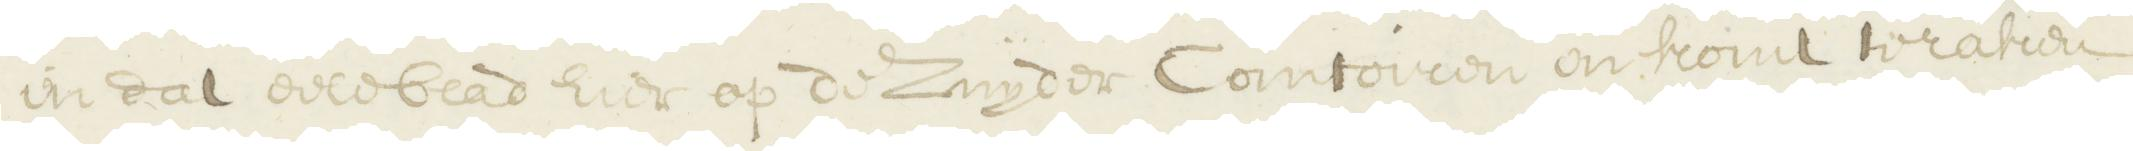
in dat deleblad hier op de zuijder Comtoiren en komt teraken
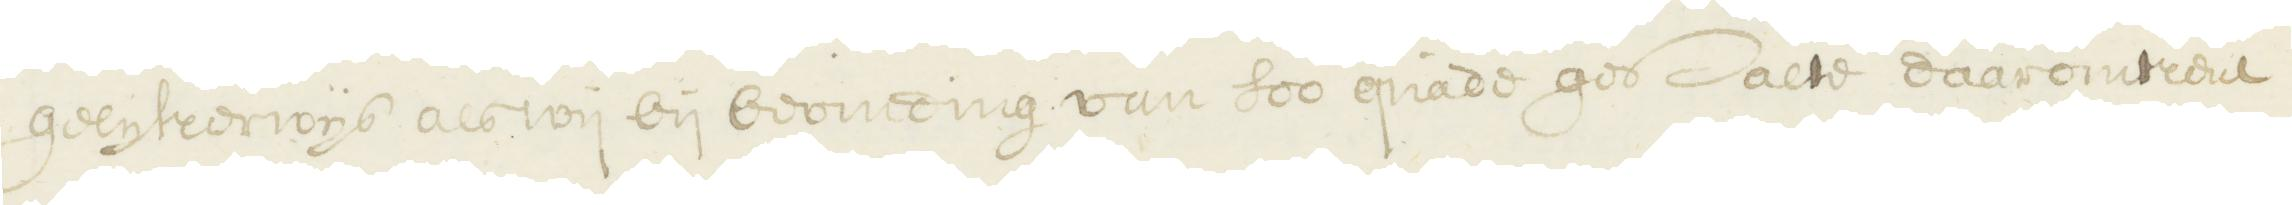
gelijkerwijs als wij bij bevinding van soo quade gestalte daaromtrent
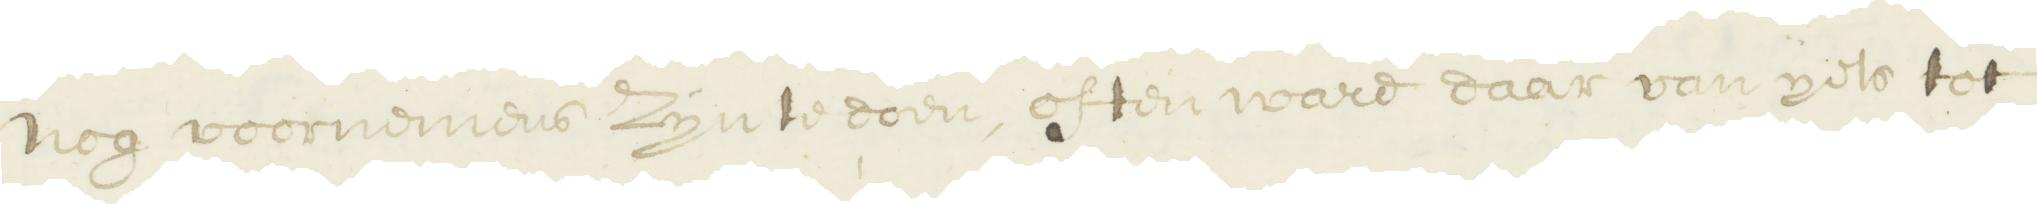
nog voornemens zijn te doen, often ware daar van ijets tot
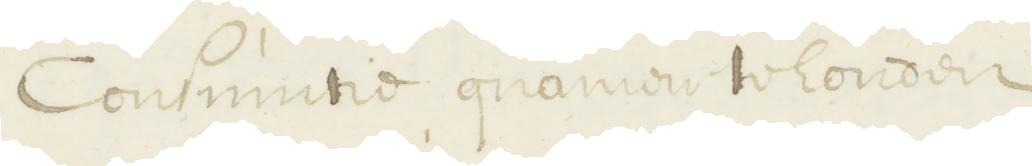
Consumtie quamen te houden
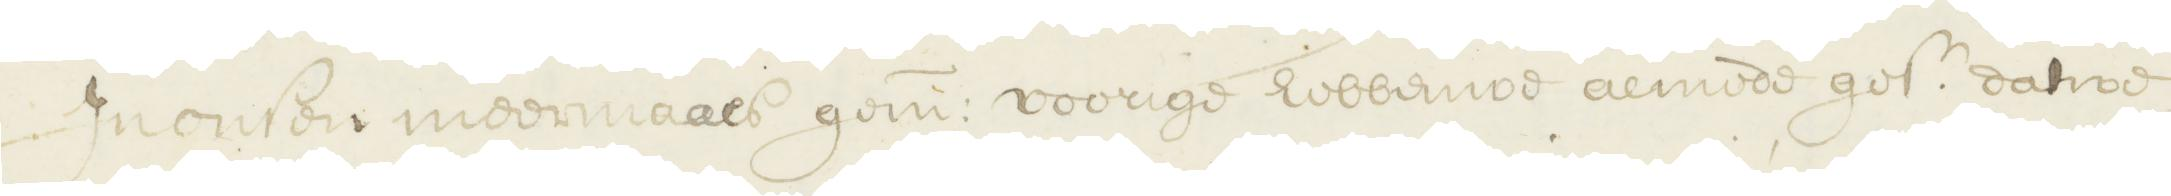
In onsen meermaals gem: voorige hebbenwe almede ges: datwe
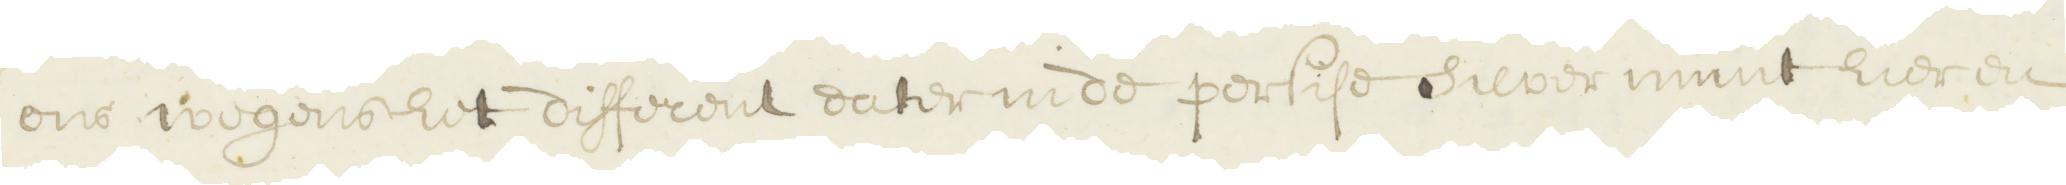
ons wegens het different dater in de persise silver munt hier en
